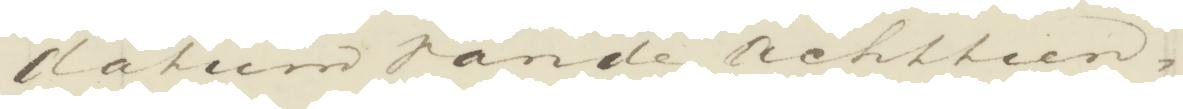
datum van den achttien„
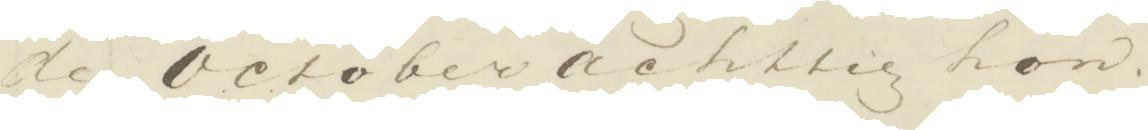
den October achttien hon.
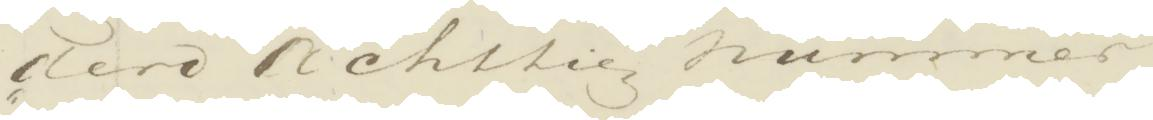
„derd Achttien, Nummer
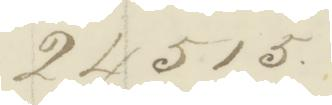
24515.
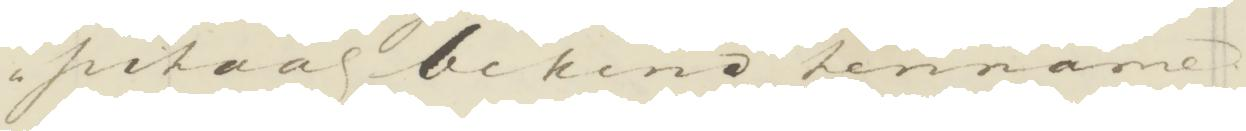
„pitaal bekend tenname
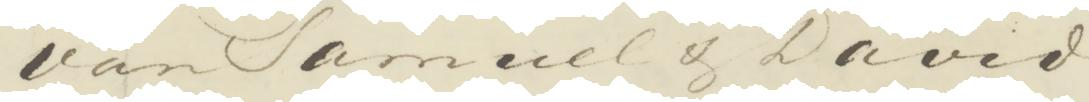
van Samuel & David
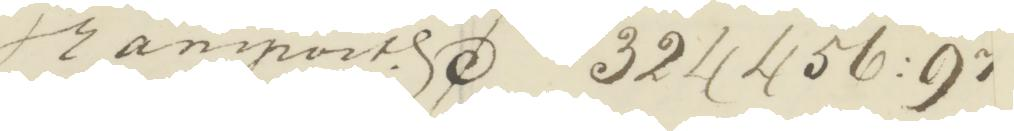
Transport. ƒ 324456: 97
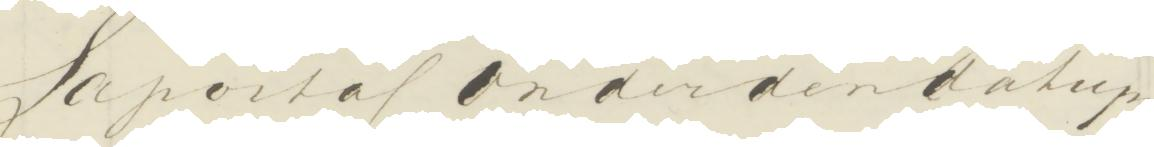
Saportas onder den datum
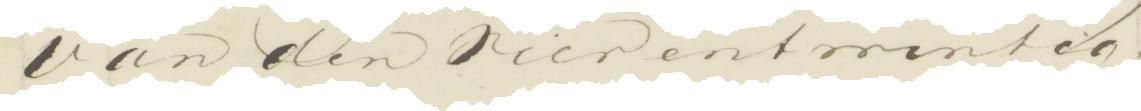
van den Vier entwintig
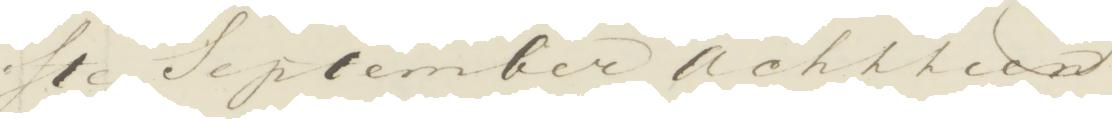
sten September Achttien
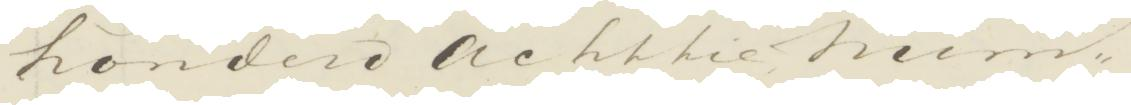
honderd Achttien num„
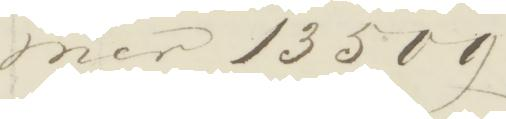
mer 13509
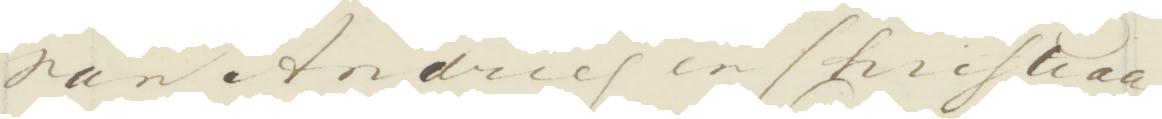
van Andries en Christiaan
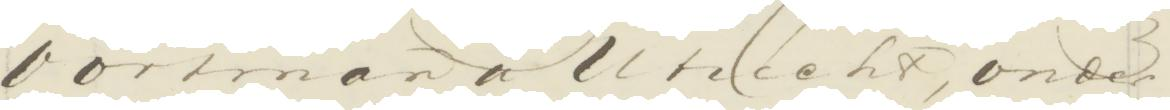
Oortman a Utrecht, onder
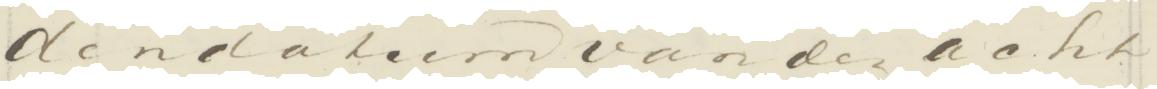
den datum van den acht
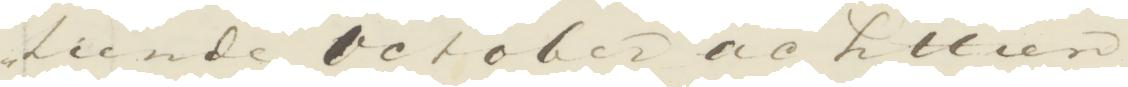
„tienden October achttien
